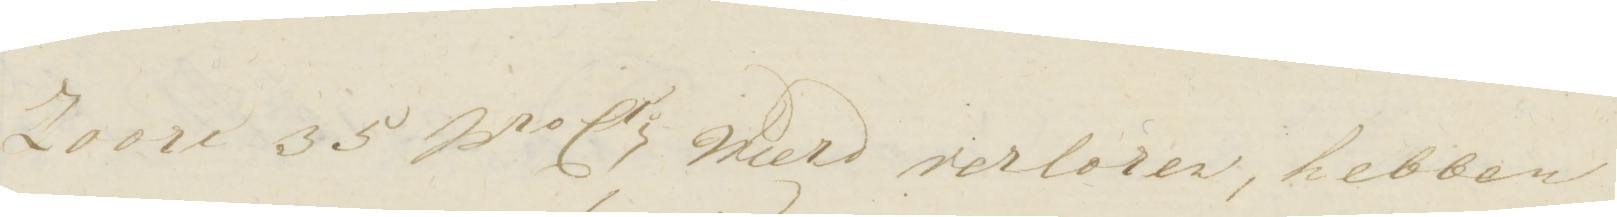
Zoort 35 pro C„to wierd verloren, hebben
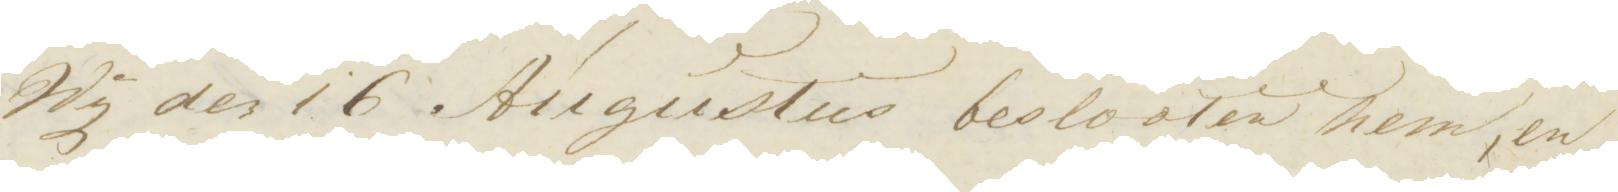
Wij den 16 Augustus beslooten hem, en
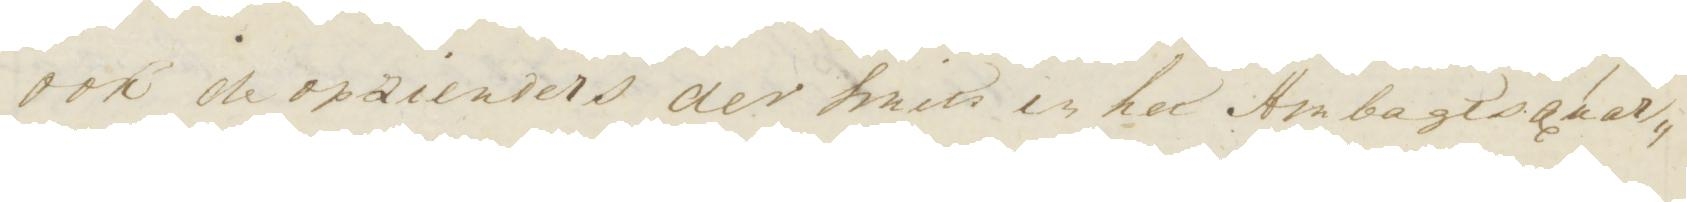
ook de opzienders der Smits in het Ambagtsquar„
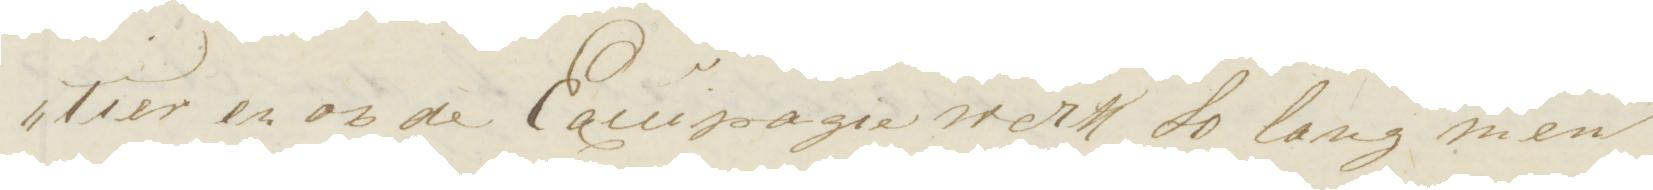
„tier en op de Equipagie werk so lang men
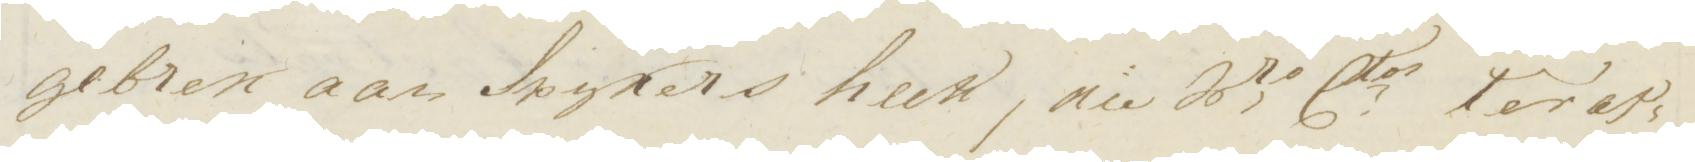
gebrek aan spijkers heeft , die p:ro C:tos ter af„
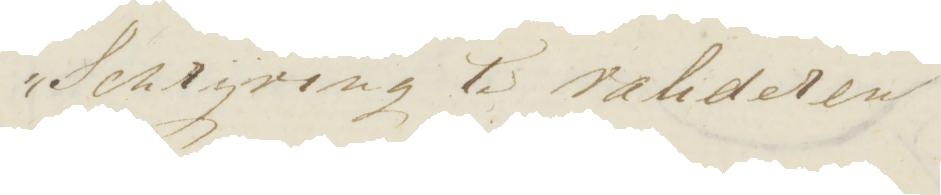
„schrijving te valideren
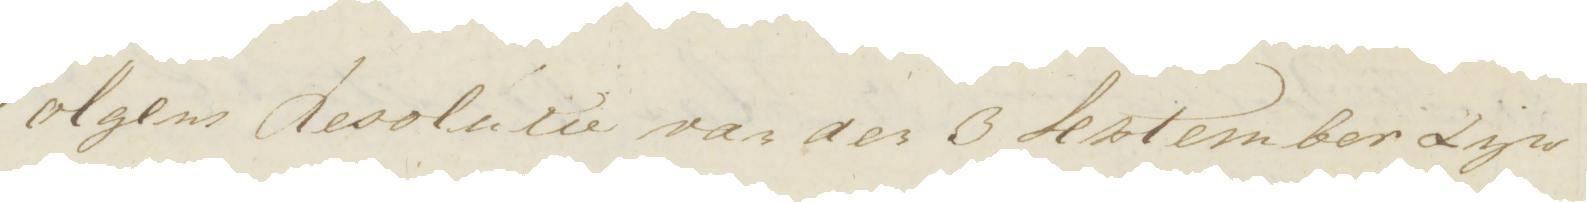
olgens Resolutie van den 3 September zijn
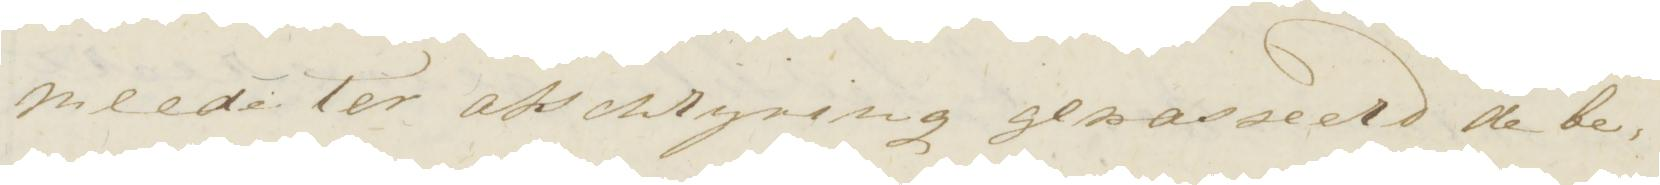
meede ter afschrijving gepasseerd de be„
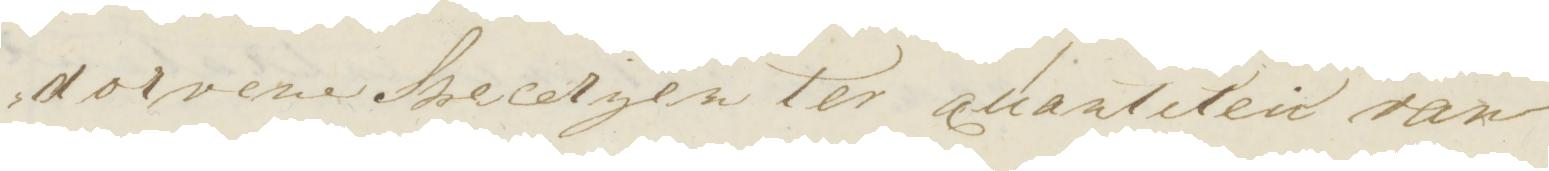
„dorvene specerijen ter quantiteit van
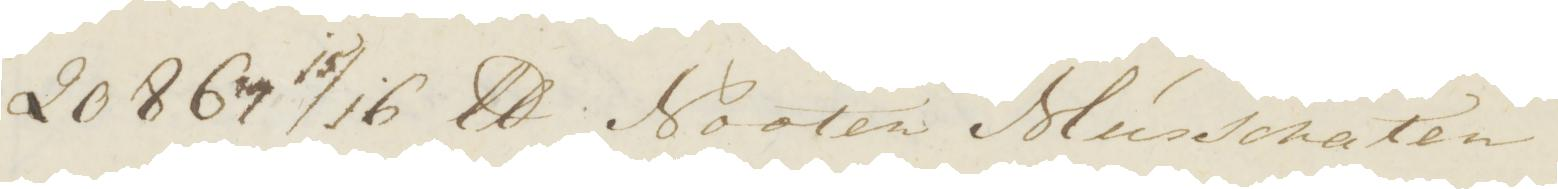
20867 15/16 lb Nooten Musschaten
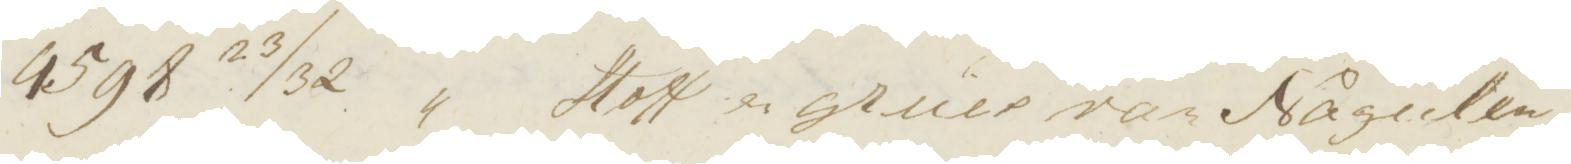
4598 23/32 „ Stoff en gruel van Nagulen
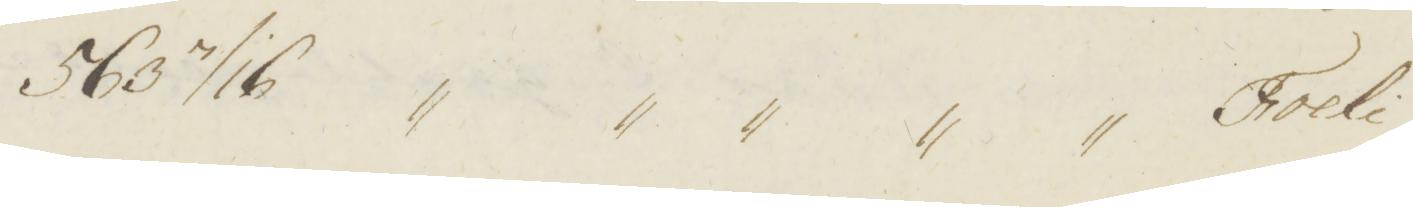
563 7/16 „ Foeli
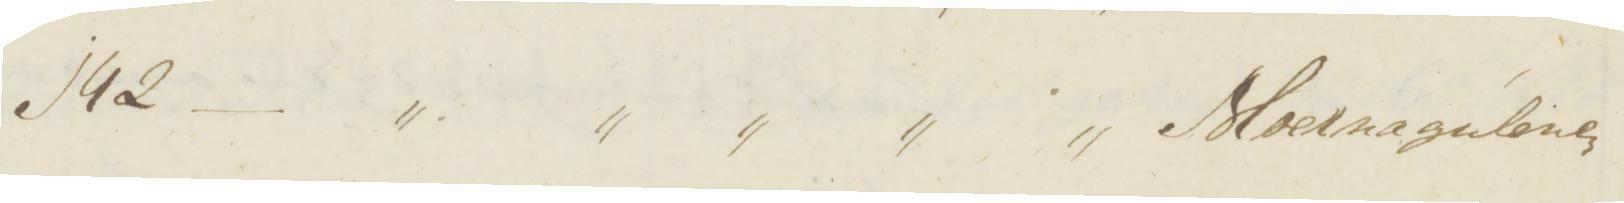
142 — „ Moernagulenen
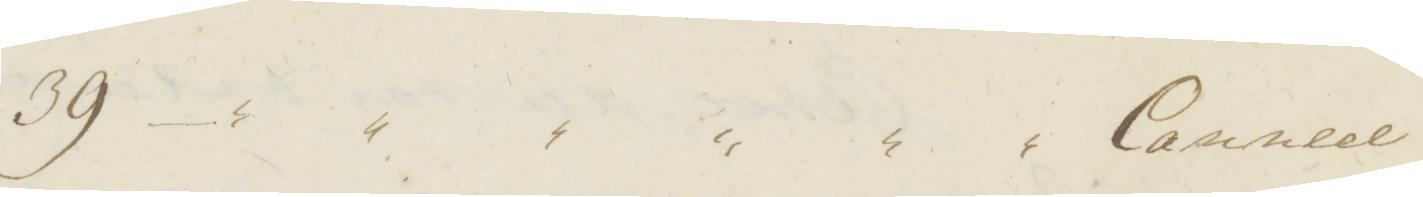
39 — „ Canneel
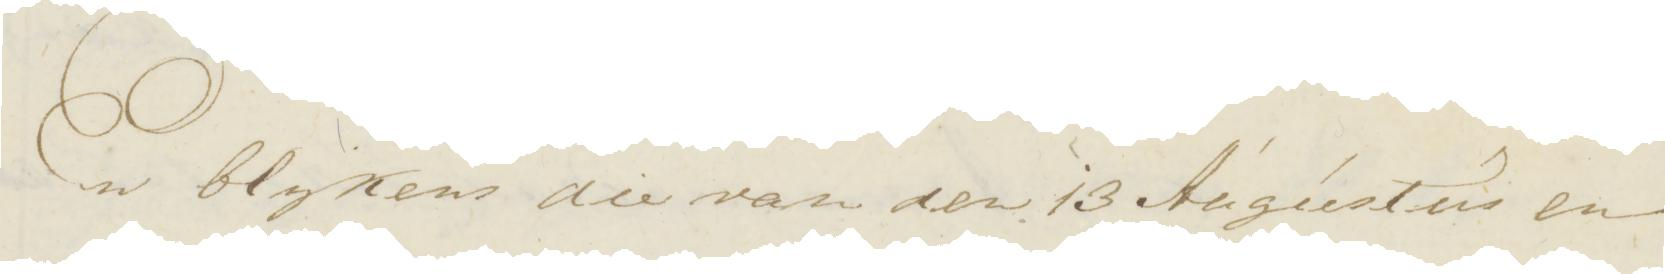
En blijkens die van den 13 Augustus en
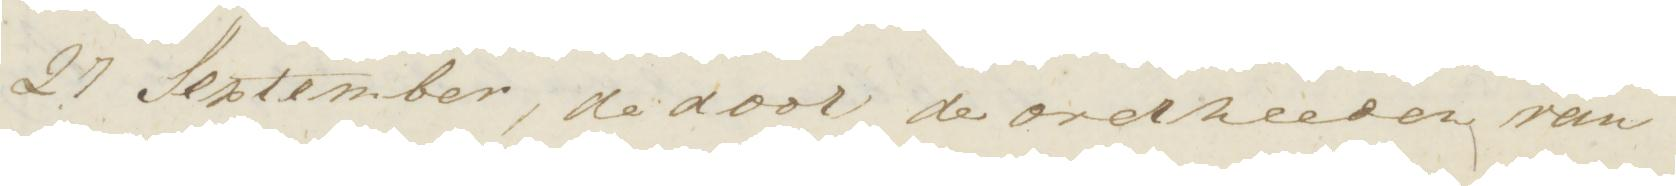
27 September, de door de overheeden van
